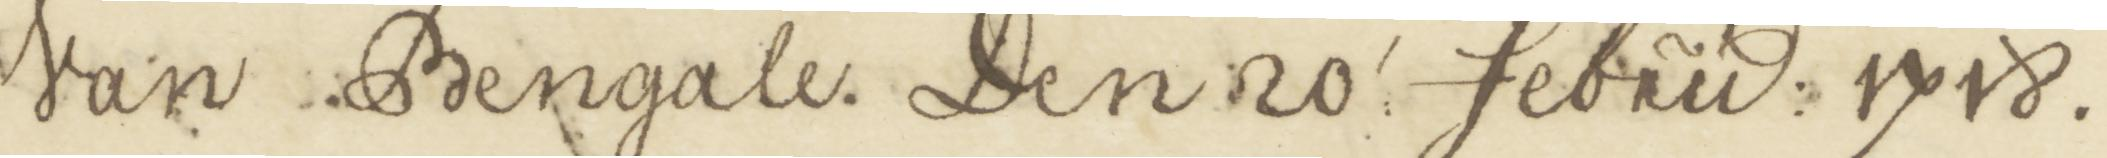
Van Bengale Den 20:' febru: 1718.
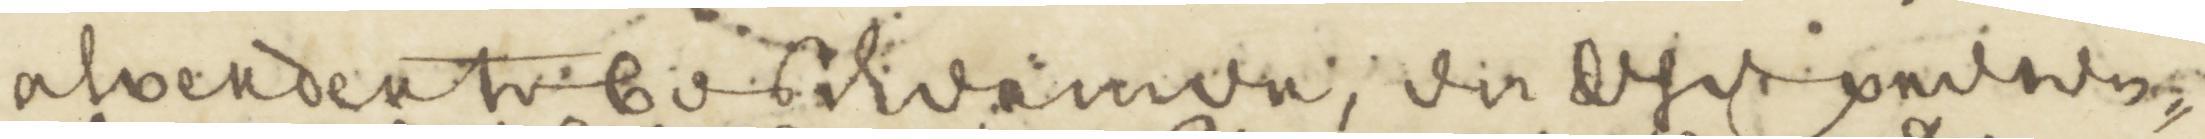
alverder te bescheamen, en dese preten„
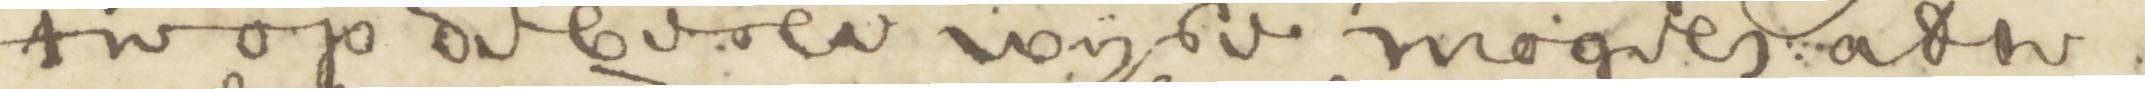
tie op de beste wijse mogelijk af te
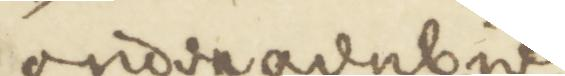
onder aenbie
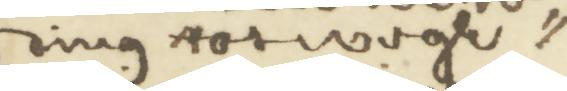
ding tot wegh
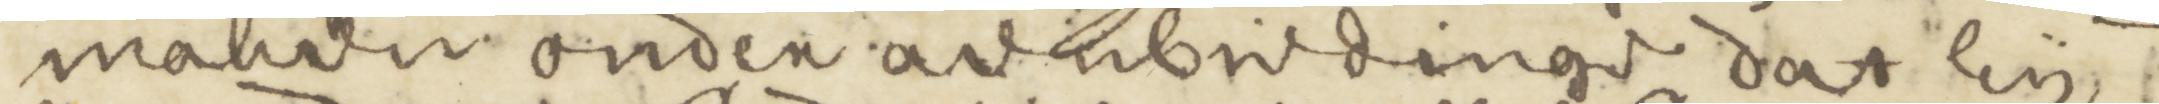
maken onder aenbiedinge dat hij
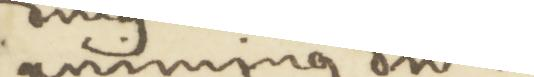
ruiming dier
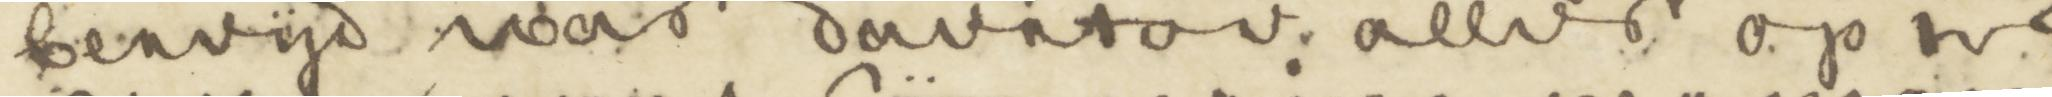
bereijd was daertoe, alles op te
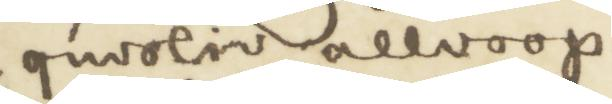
questie alles op
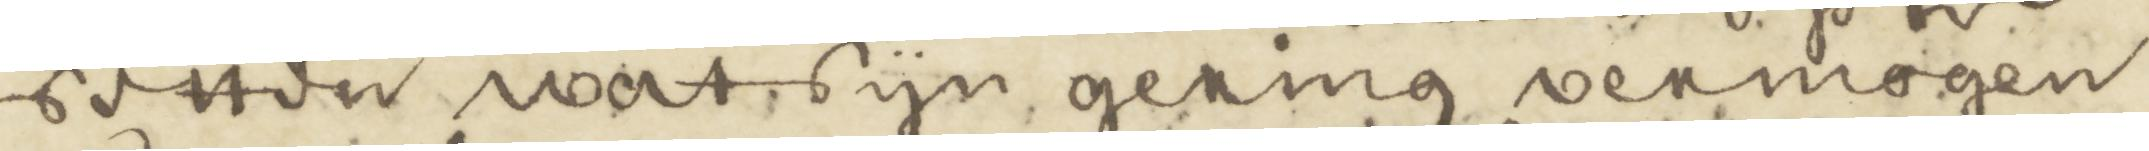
setten wat sijn gering vermogen
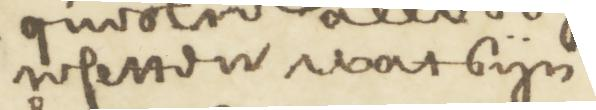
te setten wat sijn
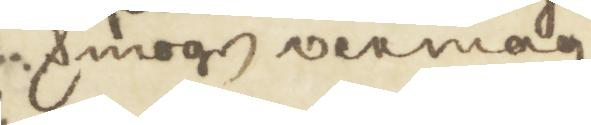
vermogen vermag
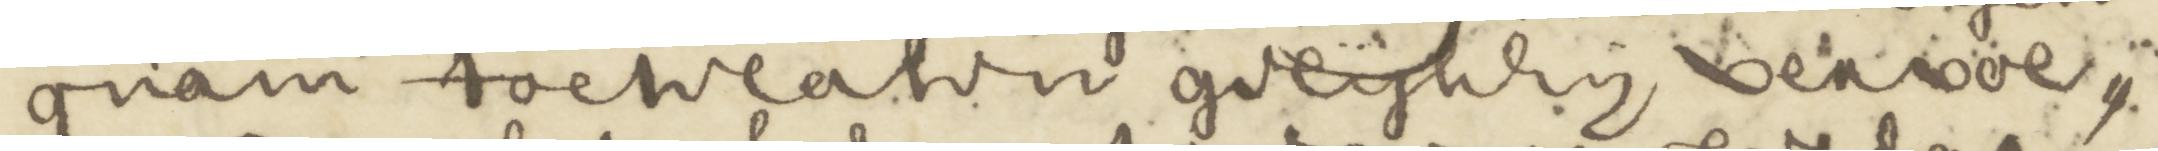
quam toetelaten gelijk hij vervol„
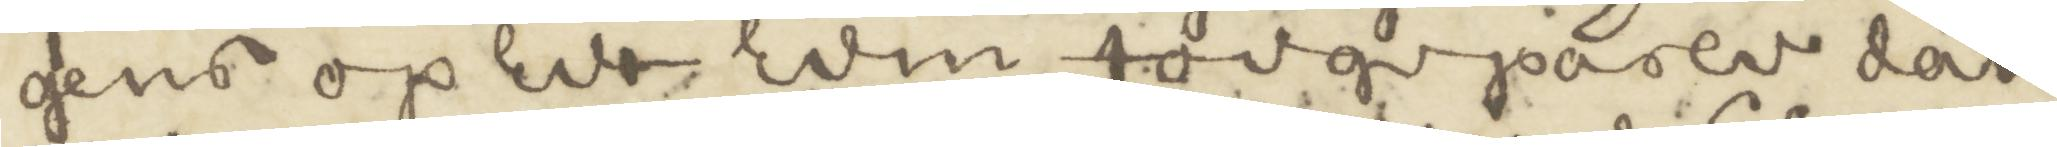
gens op het hem toegepaste dat
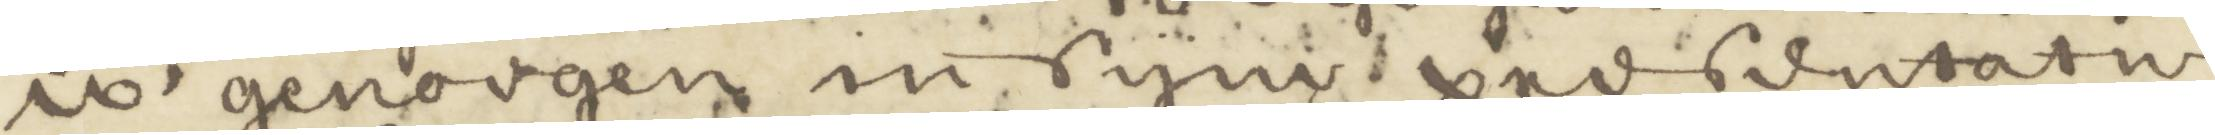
w' genoegen in sijne presentatie
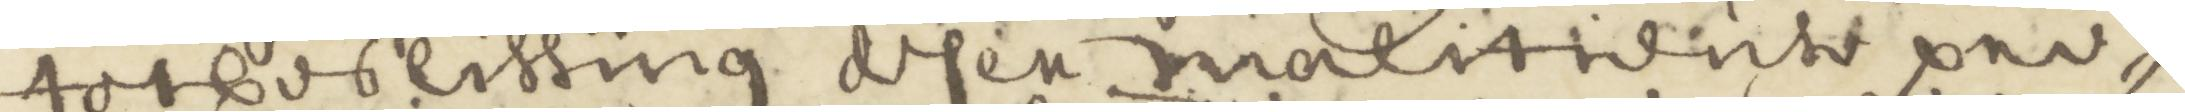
tot beslissing deser malitieuse pre„
